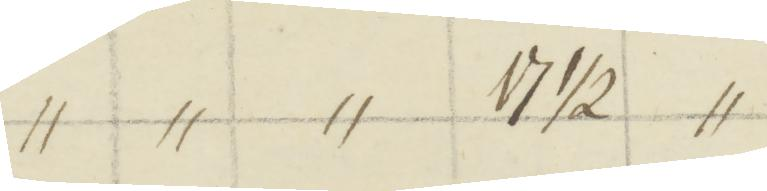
„ „ „ 17½ „
